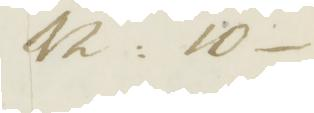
42: 10 —
